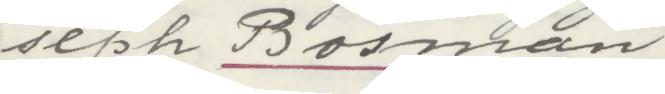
seph Bosman
